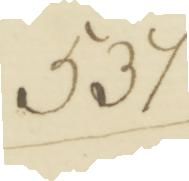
537
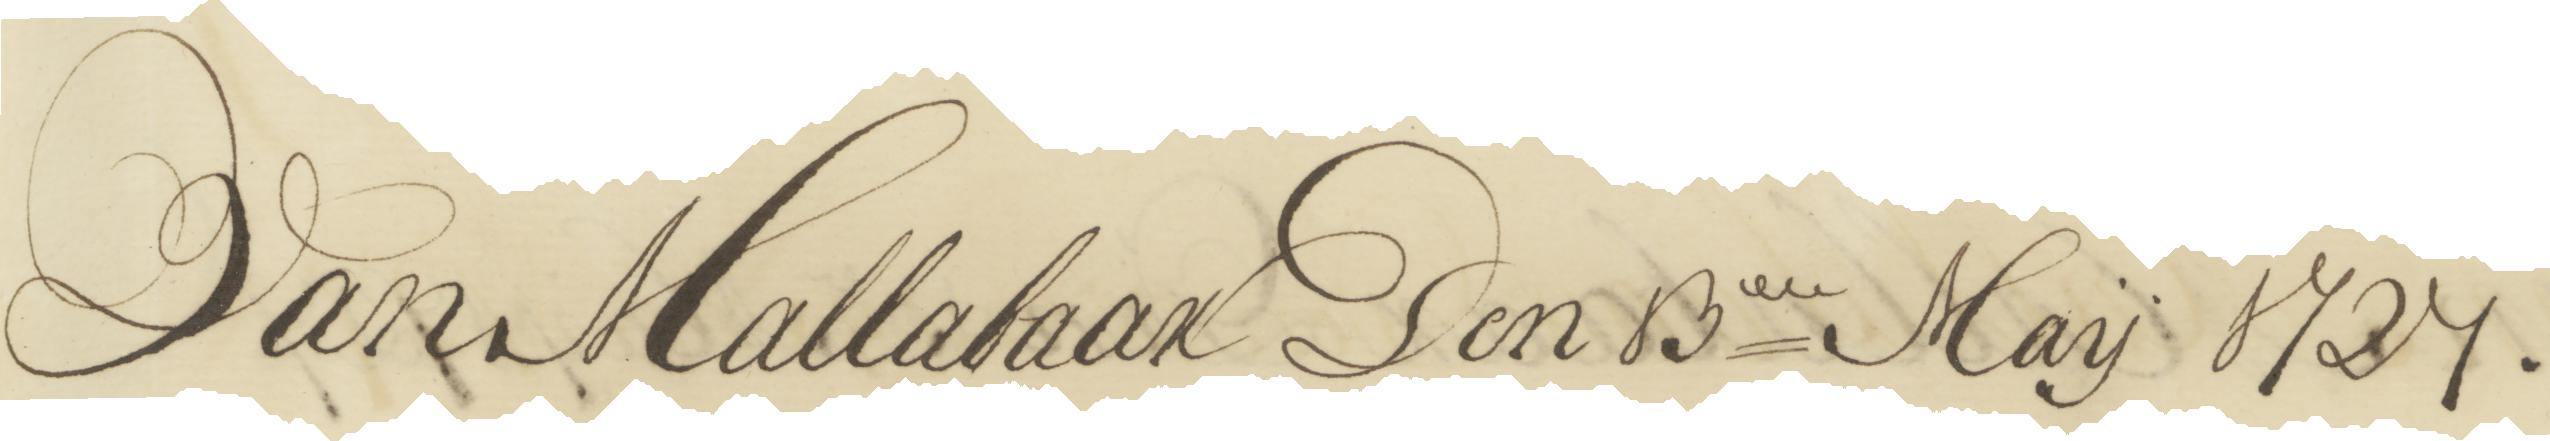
Van Mallabaar Den 13=en Maij 1727.
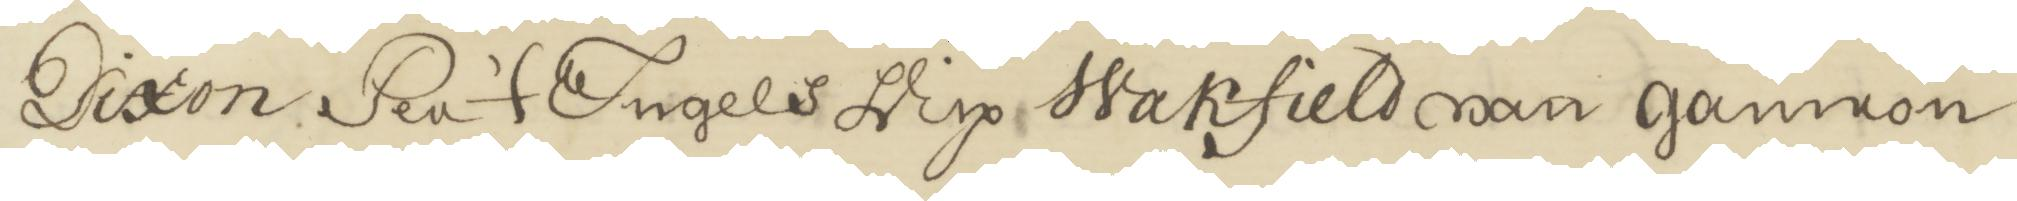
Dixon Per ’t Engels schip Wakfield van gamron
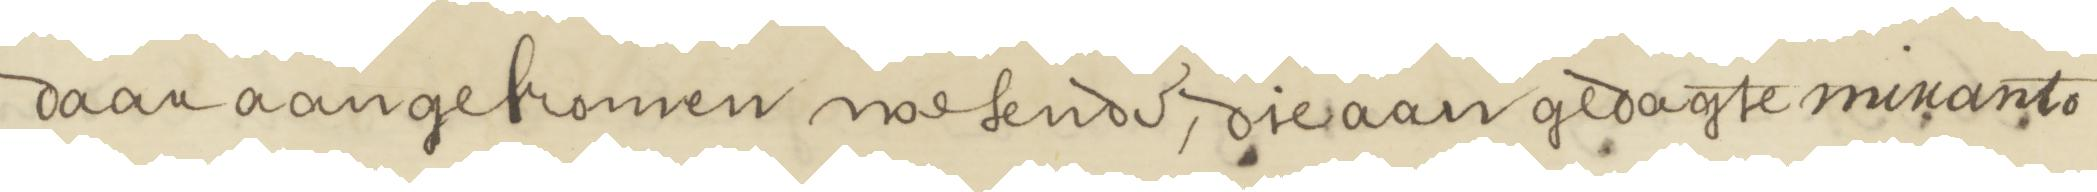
daar aangekomen wesende, die aan gedagte miranto
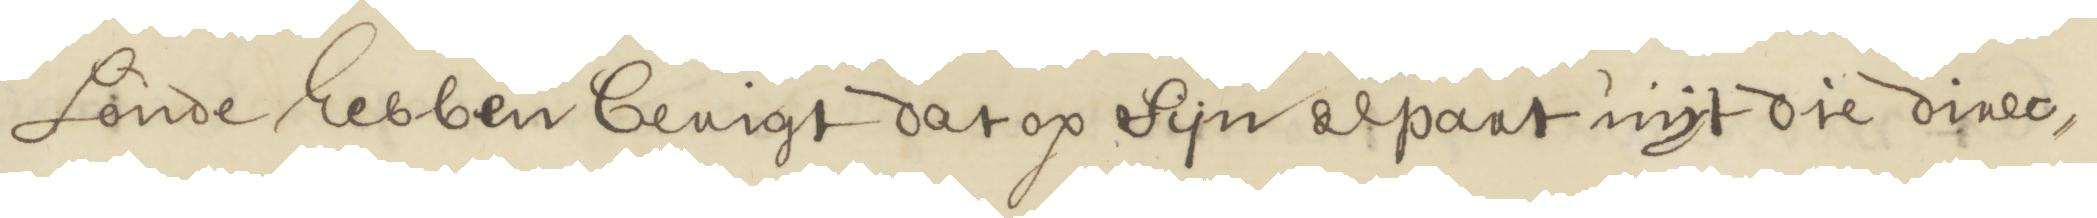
soude hebben berigt dat op sijn depart uijt die direc„
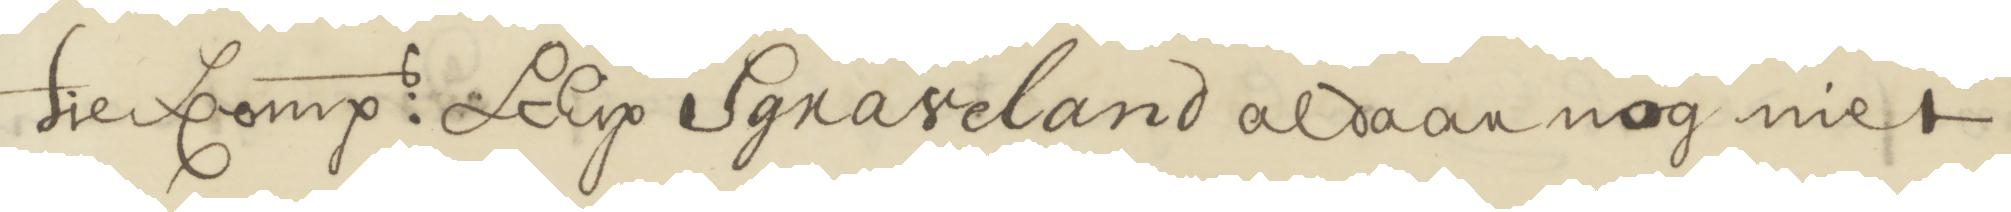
tie sComp:s schip 's graveland aldaar nog niet
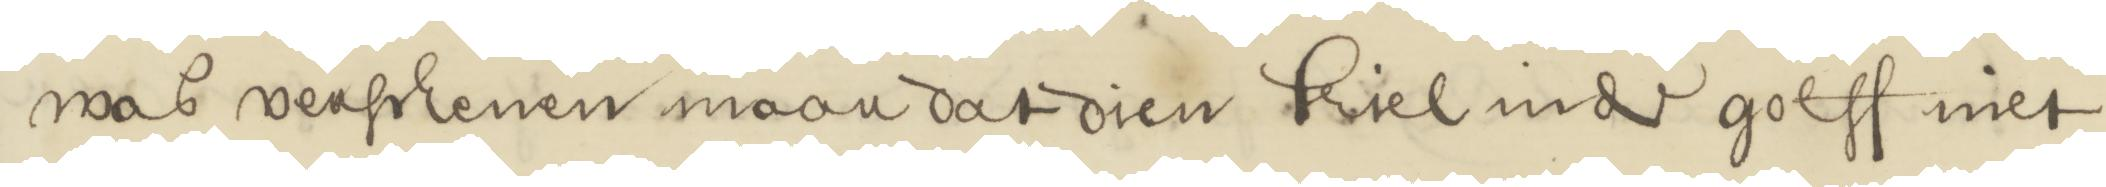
was verschenen maar dat dien kiel inde golff niet
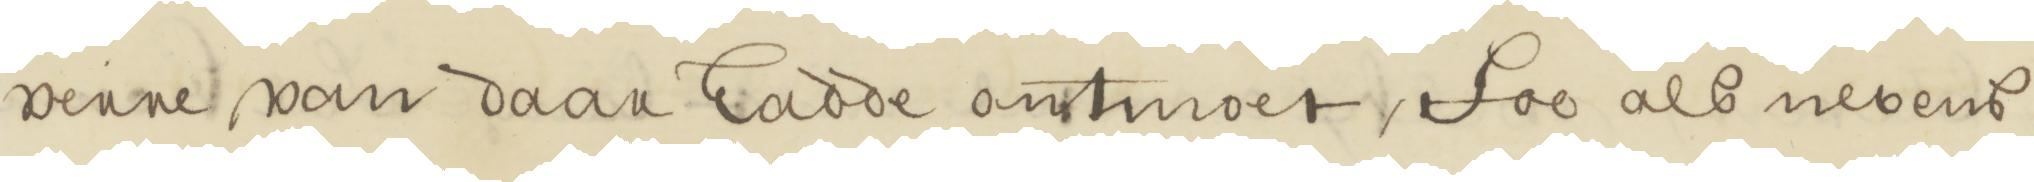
verre van daar hadde ontmoet, soo als nevens
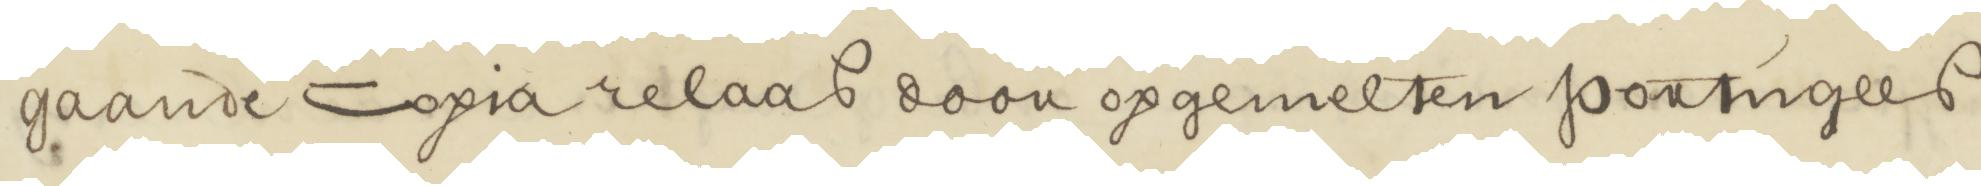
gaande copia relaas door opgemelten portugees
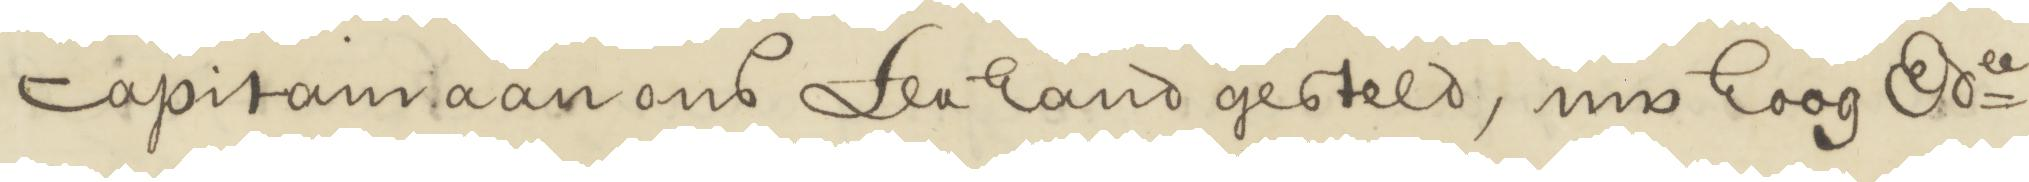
capitain aan ons ter hand gesteld, uw hoog Ed=le
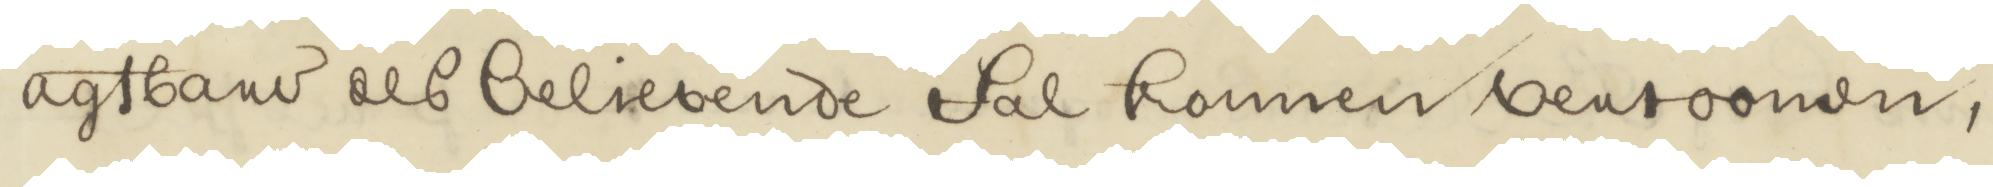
agtbare des believende sal konnen vertoonen,
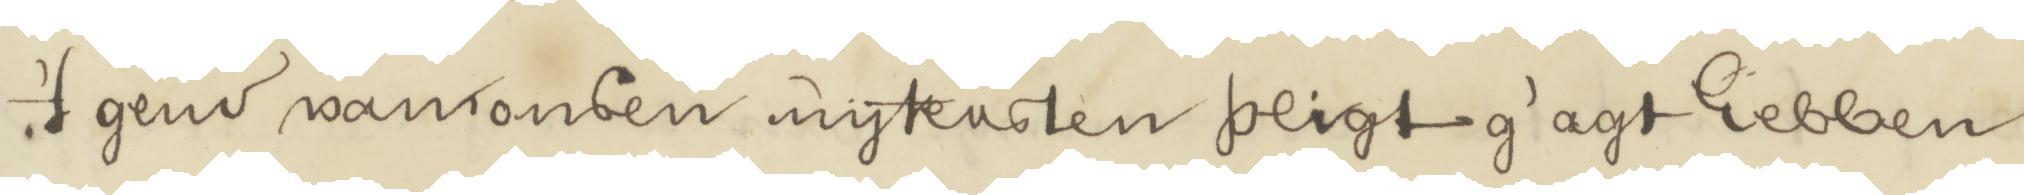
’t gene van onsen uijtersten pligt g’agt hebben
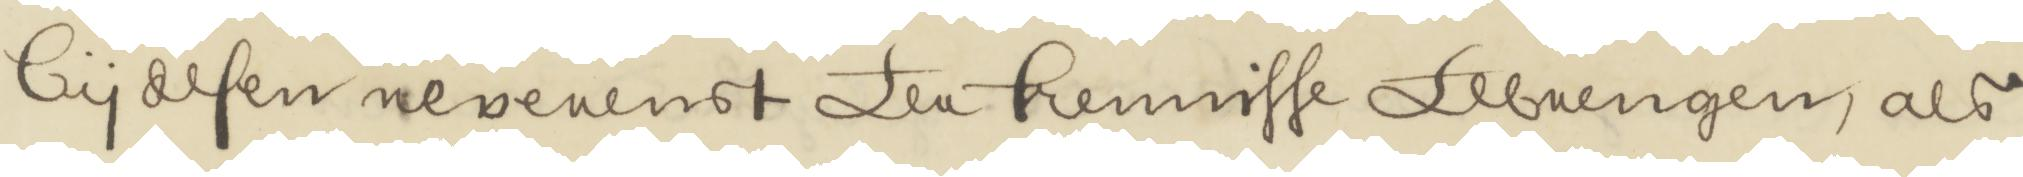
bij desen reverenst ter kennisse tebrengen, als
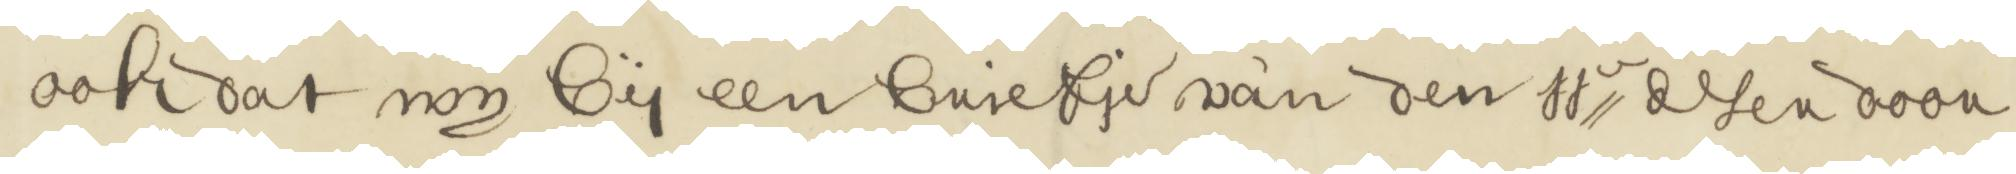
ook dat wij bij een briefje van den 11„e deser door
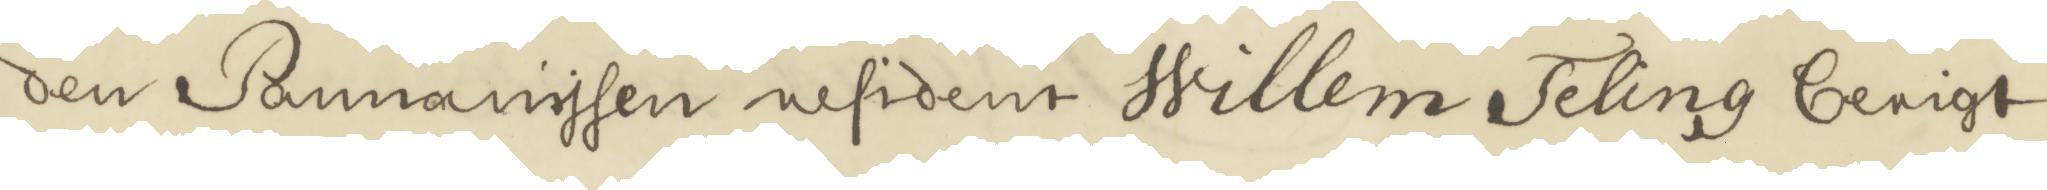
den Pannanijsen resident Willem Teling berigt
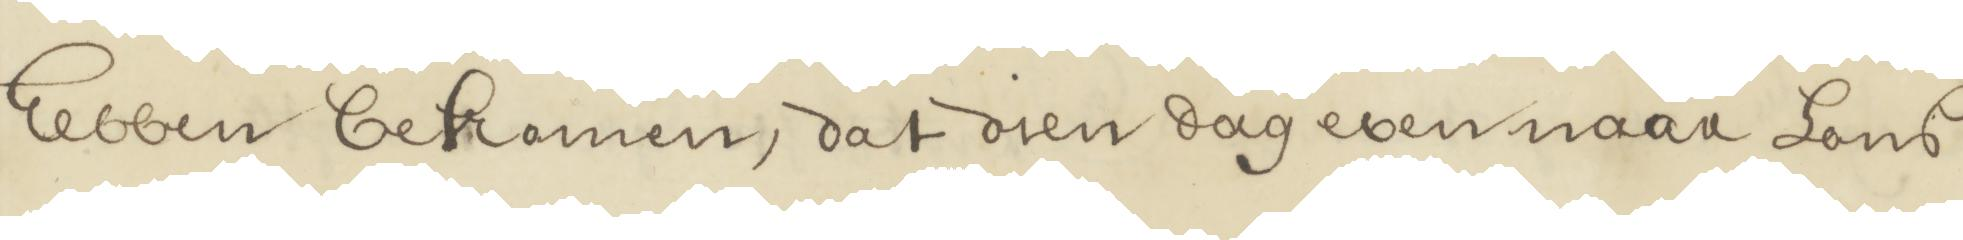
hebben bekomen, dat dien dag even naar sons
